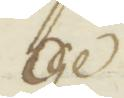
Ge
